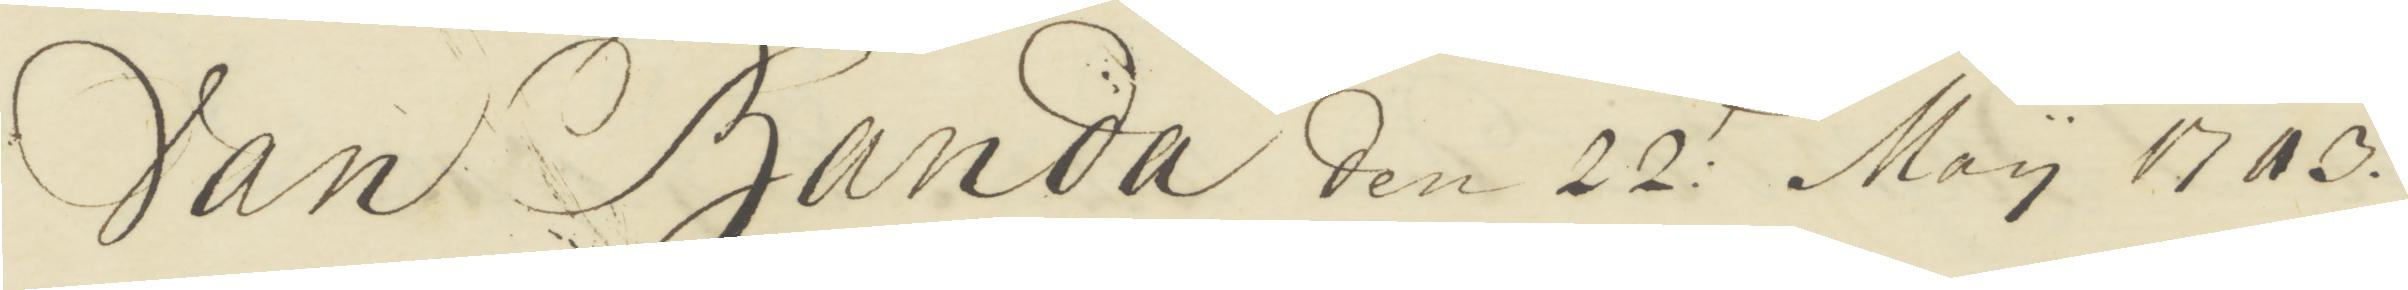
Van Banda den 22:' Maij 1743.
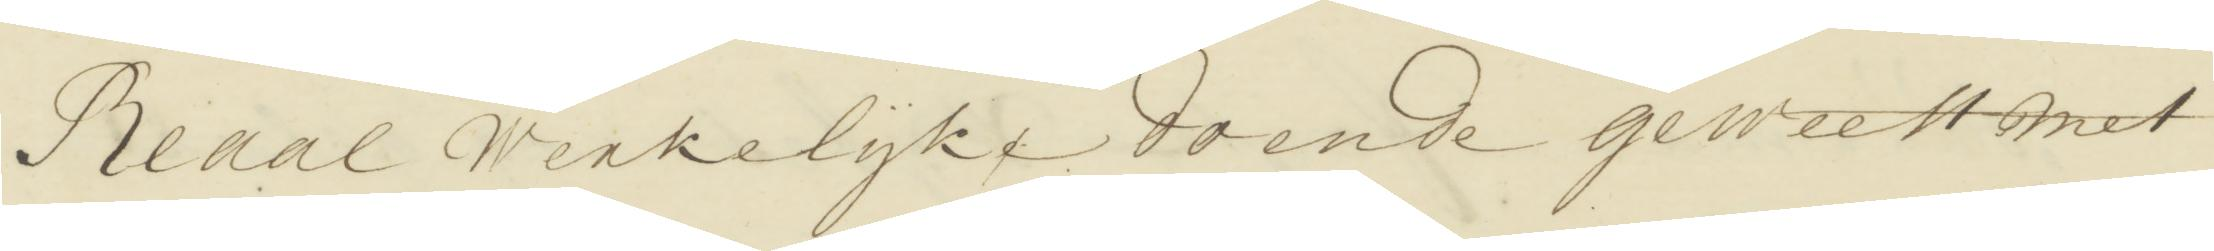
Reaal werkelijke doende geweest met
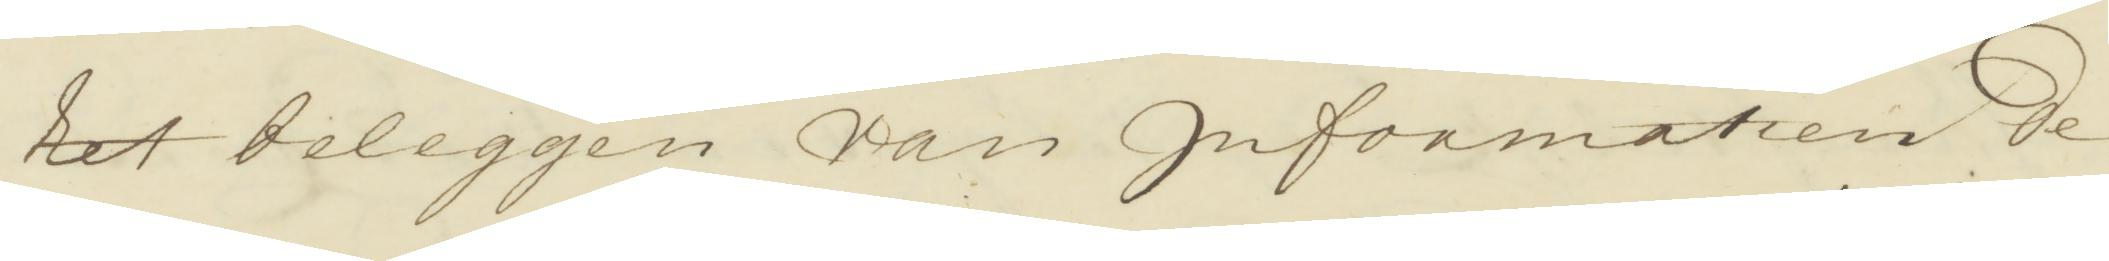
het beleggen van Jnformatien de
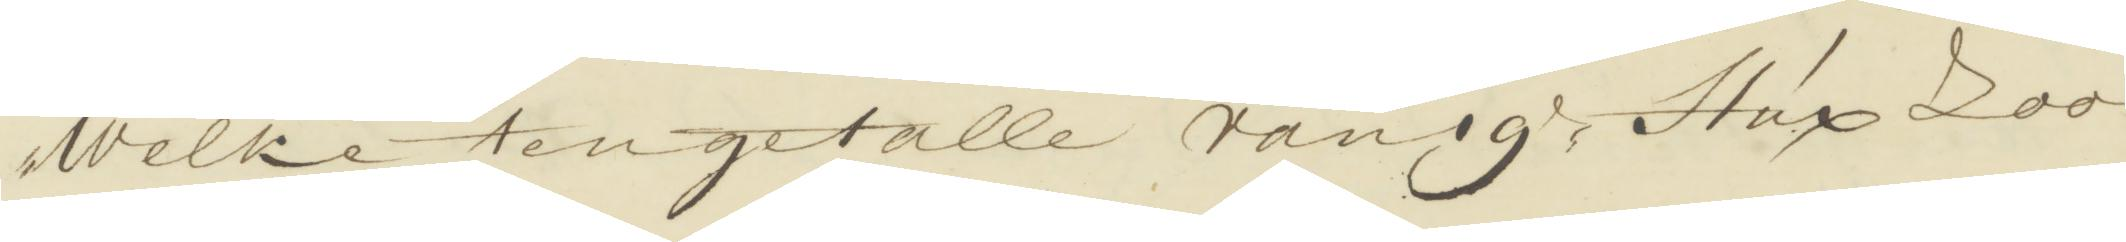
„welke ten getalle van 19' stux zoo
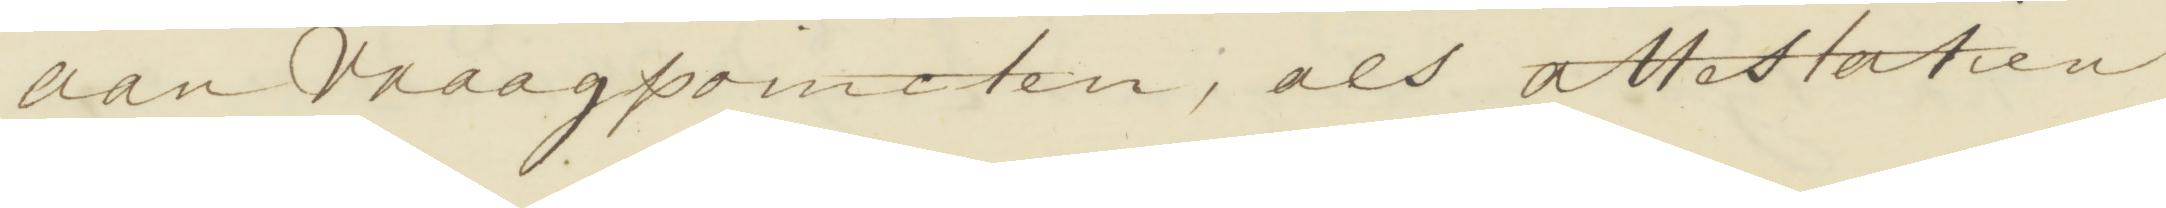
aan vraagpoincten, als attestatien
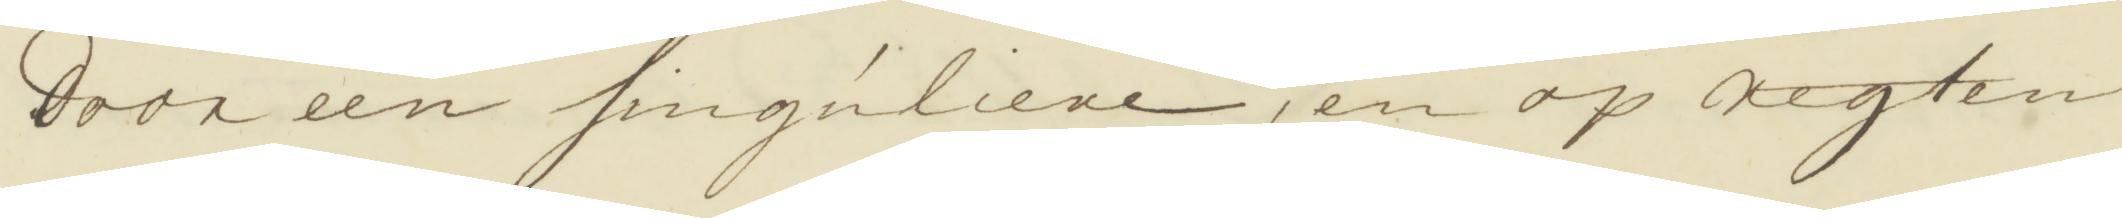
door een singuliere, en op regten
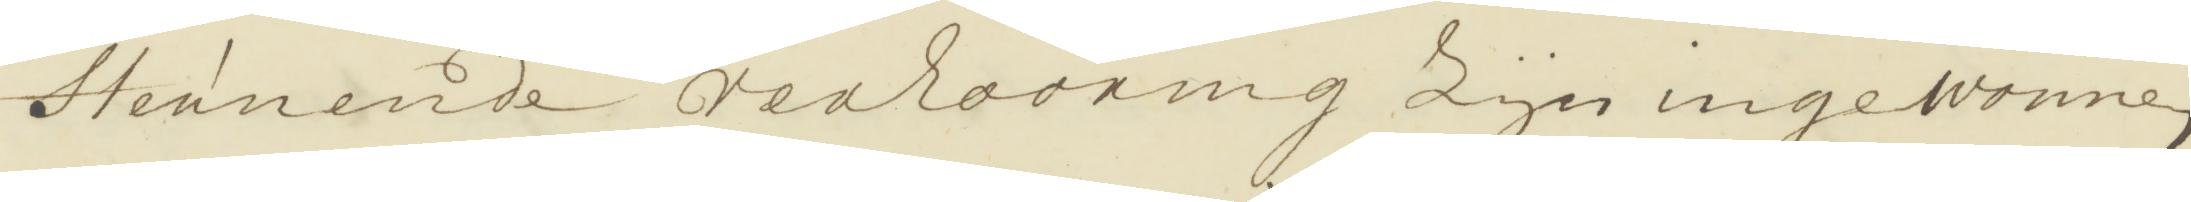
steunende verhooring zijn ingewonnen,
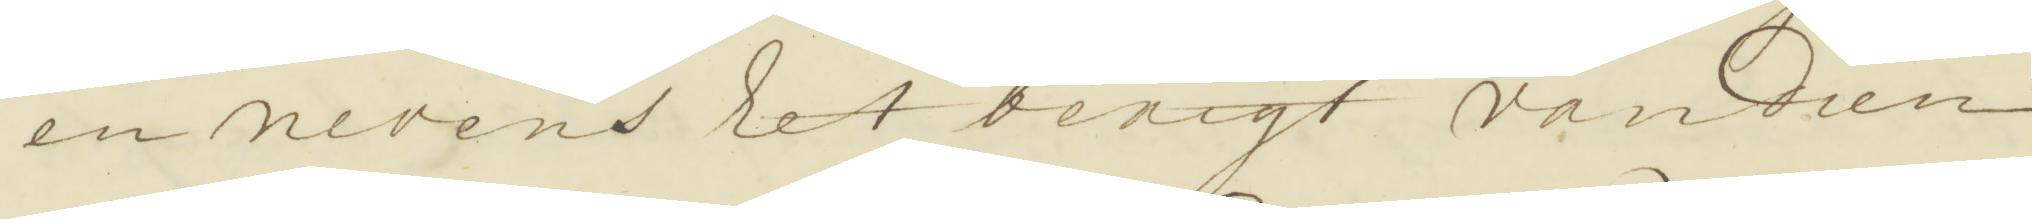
en nevens het berigt vandien
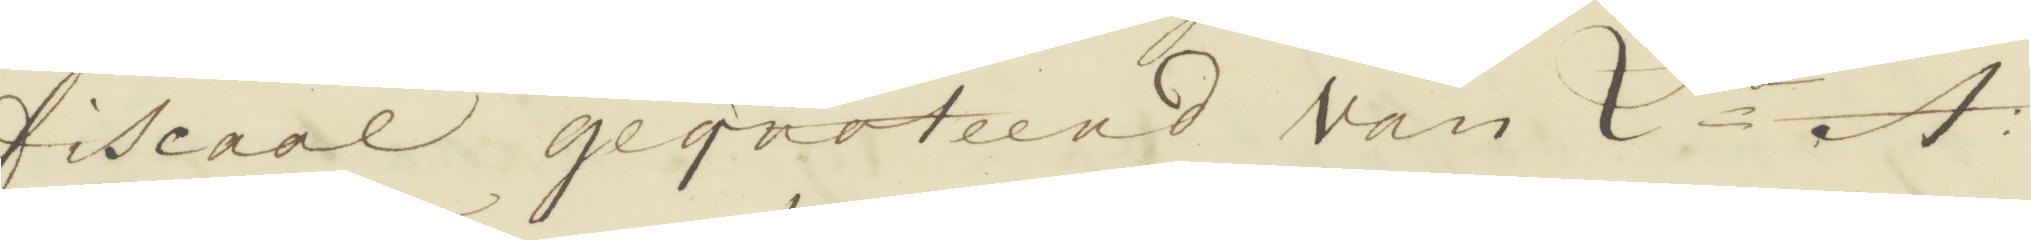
fiscaal gequoteerd van L=ra A:
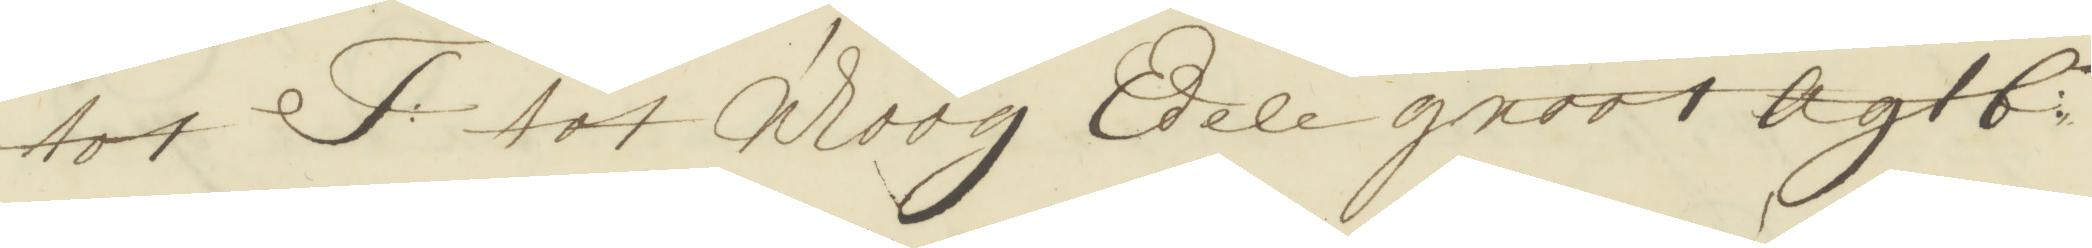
tot F: tot uhoog Edele groot Agtb:
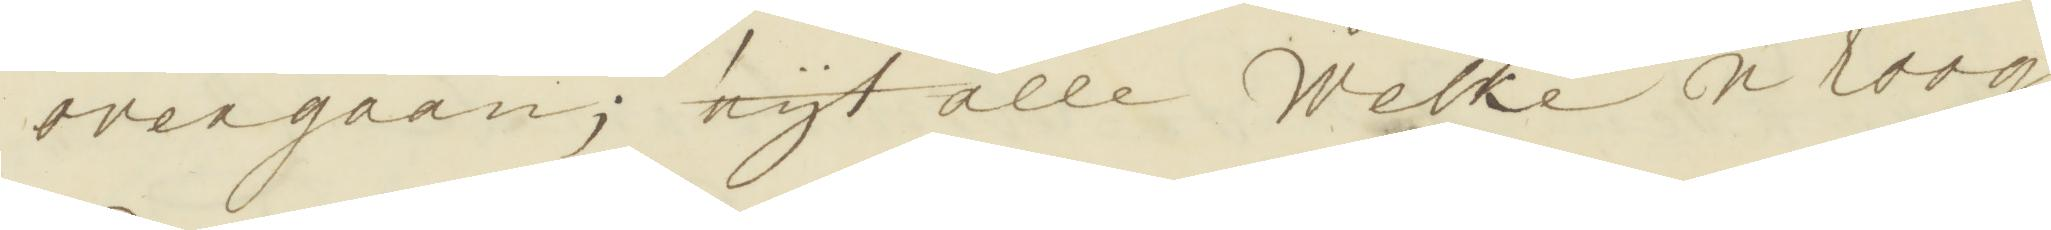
overgaan; uijt alle welke u hoog
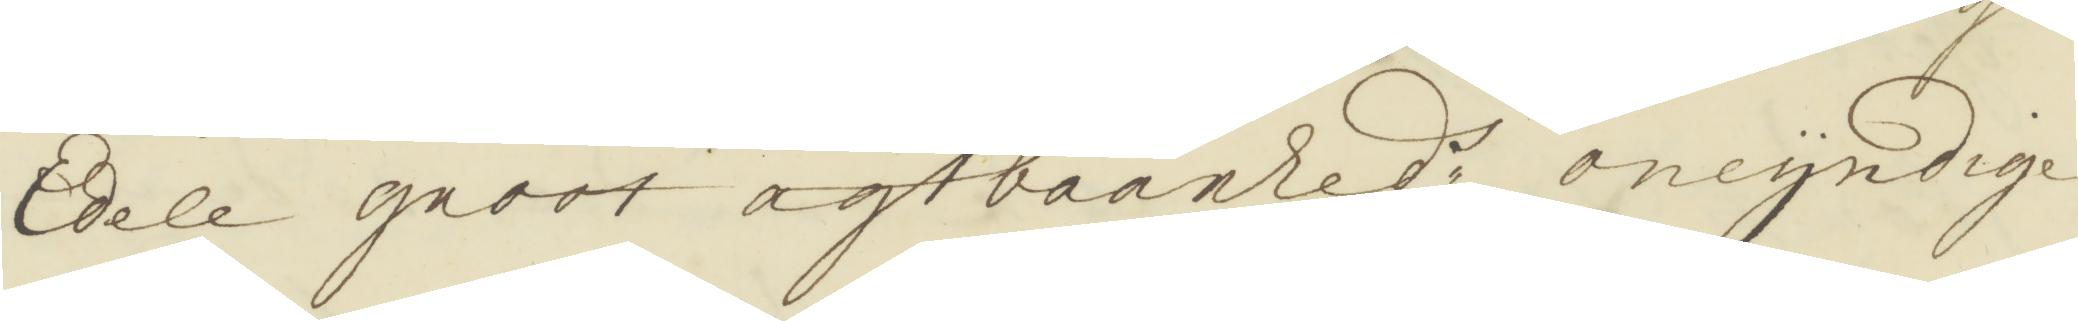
Edele groot agtbaarhed:s oneijndige
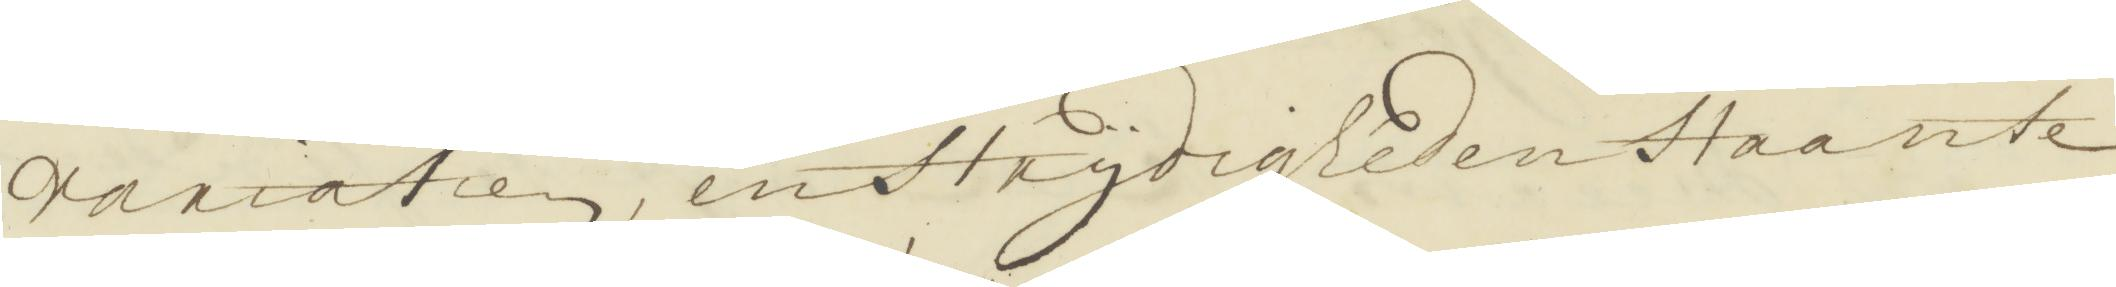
variatien, en strijdigheden staante
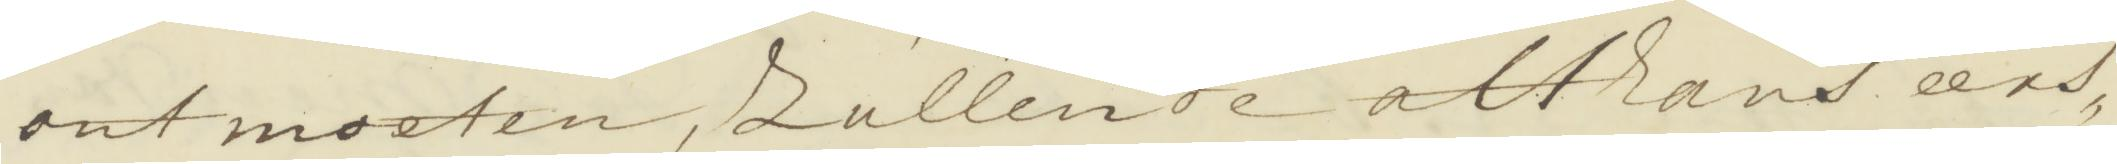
ontmoeten, zullende althans eers„
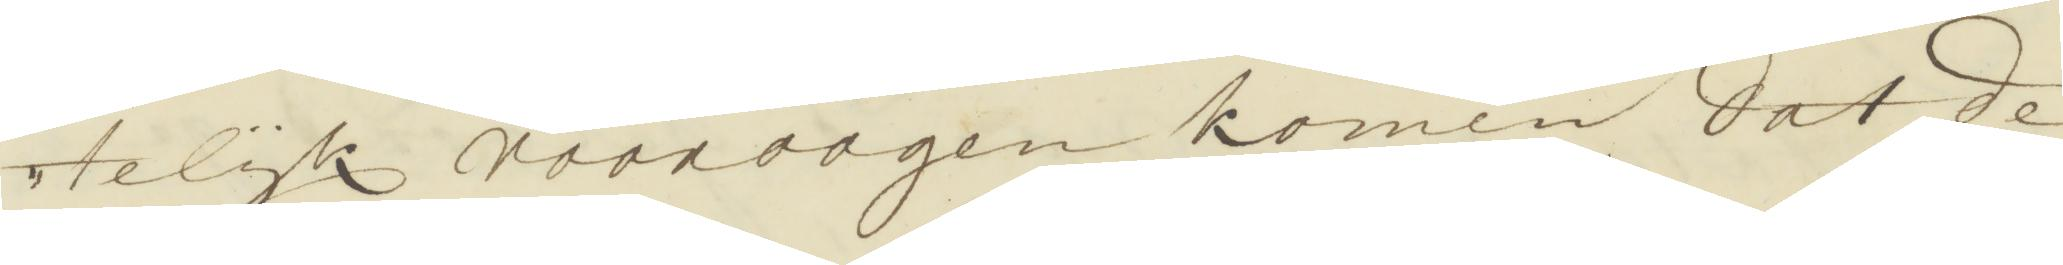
„telijk vooroogen komen dat de
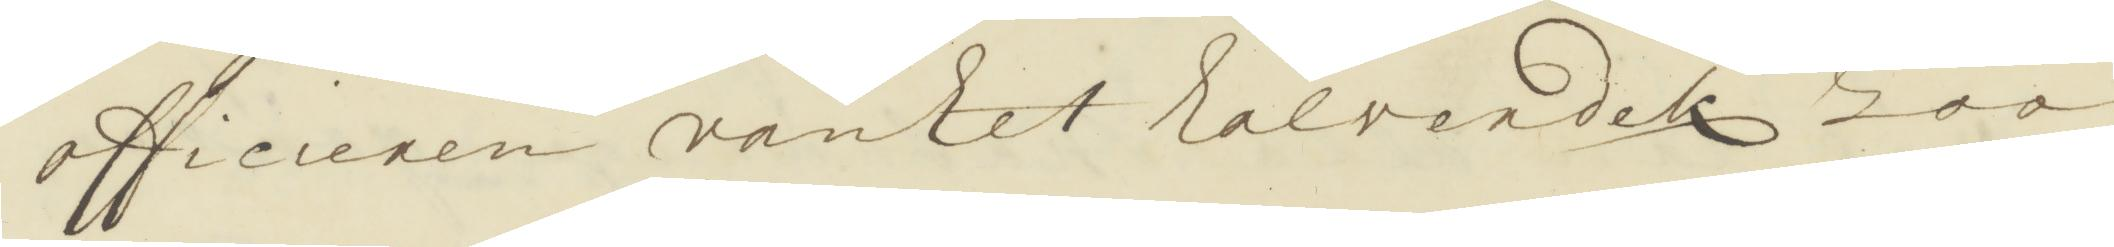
officieren van het halverdek zoo
